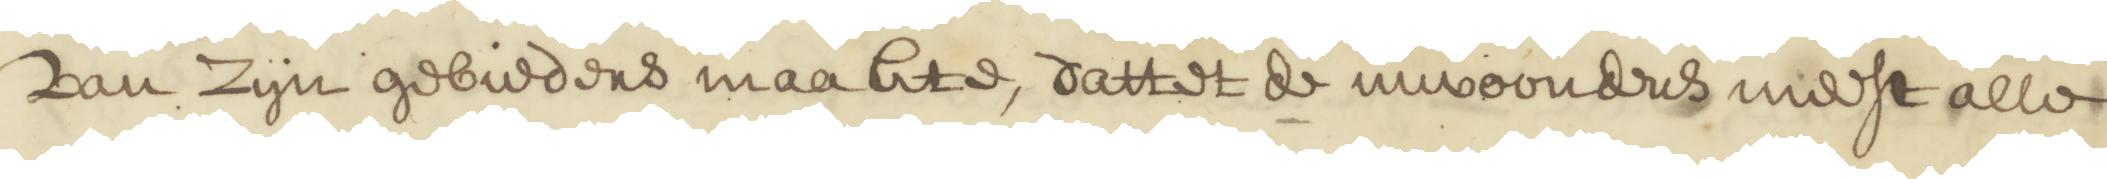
van zijn gebieders maakte, dattet de inwoonders meest alle
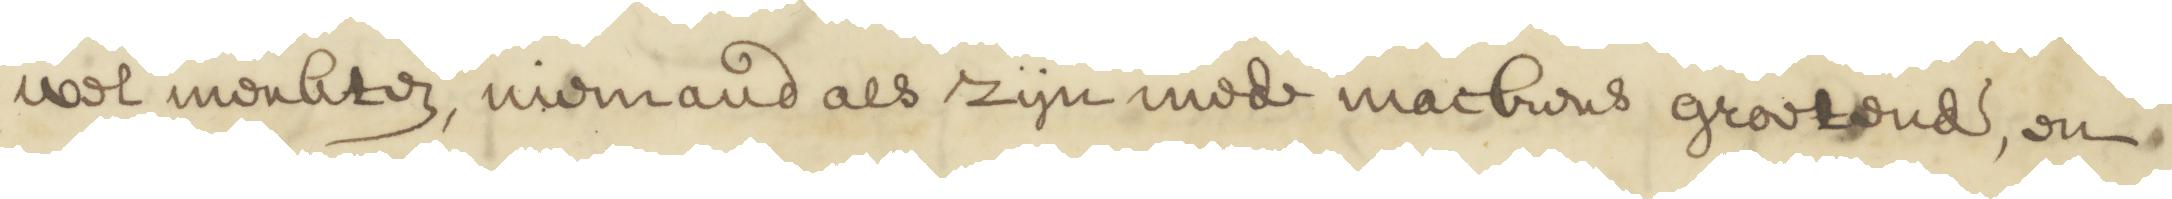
wel merkten, niemand als zijn mede mackers groetende, en
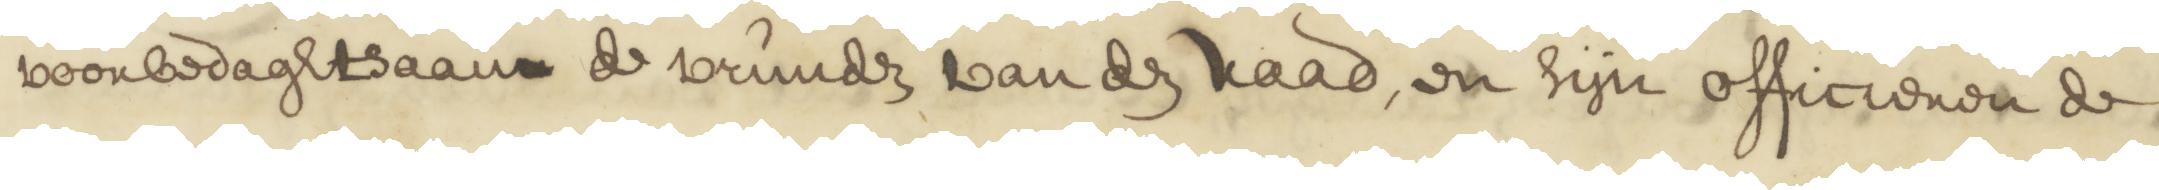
voorbedaghtsaam de vrunden van den raad, en sijn officieren de
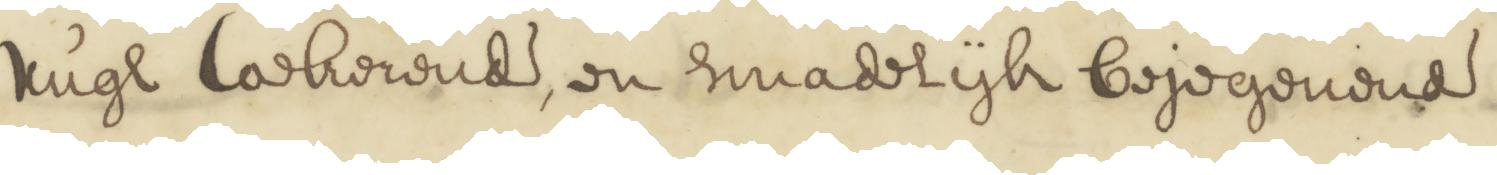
rugh toekerende, en smadelijk bejegenende
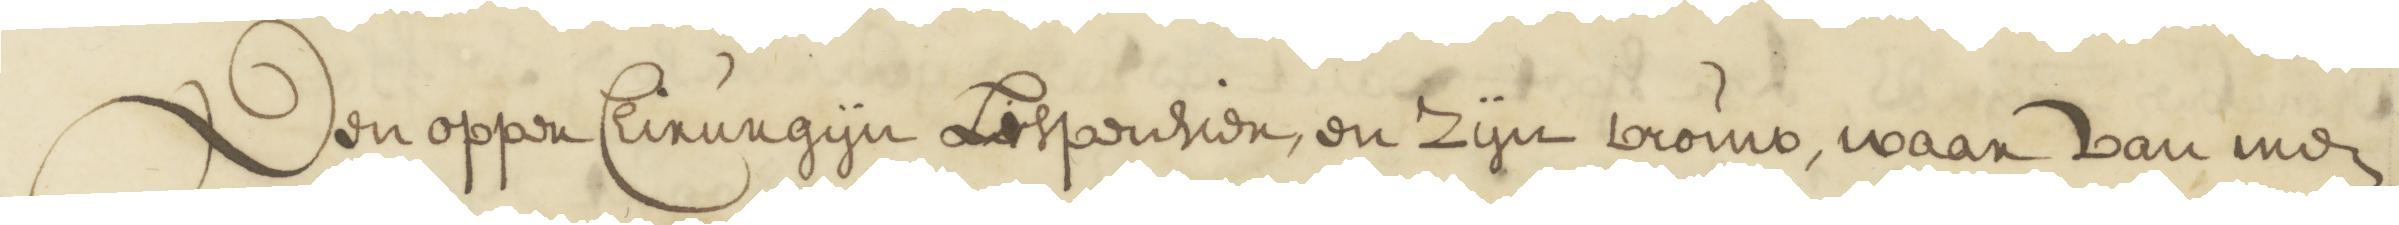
Den opper Chirurgijn Lispensier, en zijn vrouw, waar van men
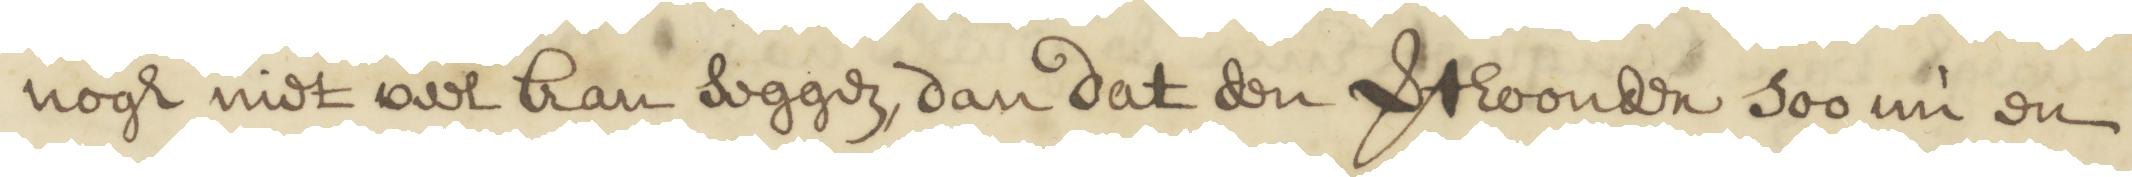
nogh niet veel kan seggen, dan dat den verthoonder soo nu en
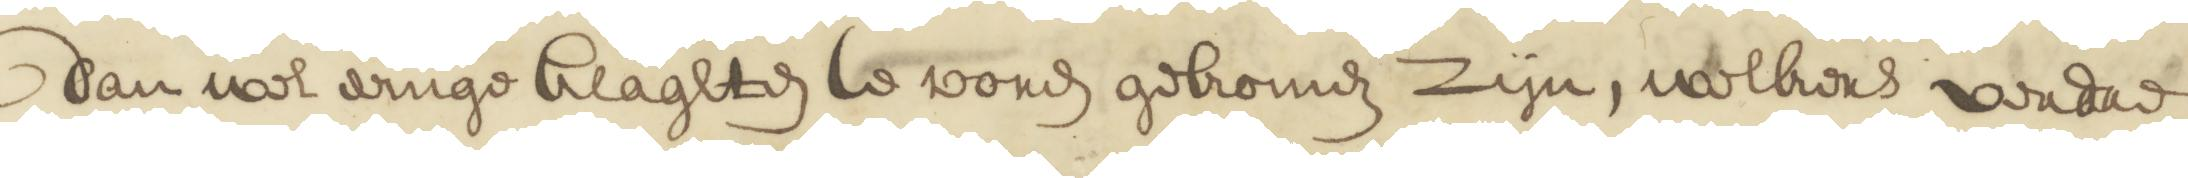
dan wel eenige klaghten te voren gekomen zijn, welkers verdre
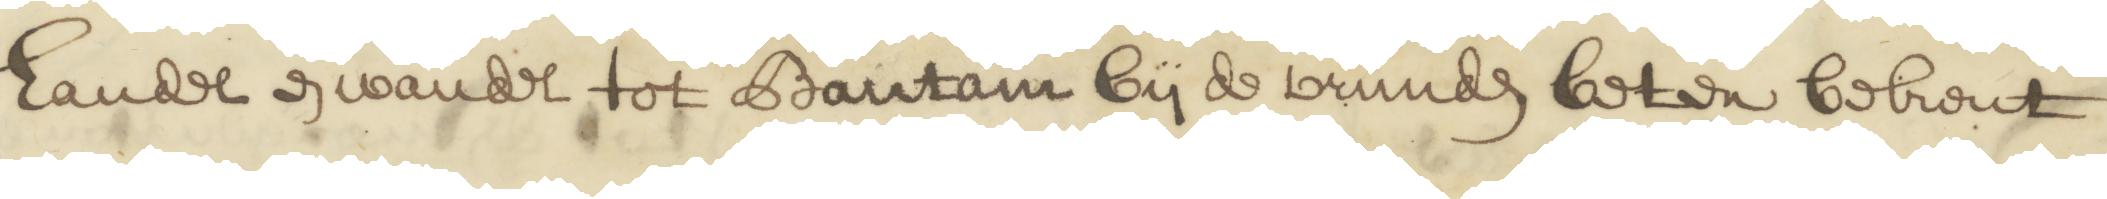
handel en wandel tot Bantam bij de vrunden beter bekent
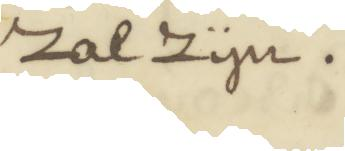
zal zijn.
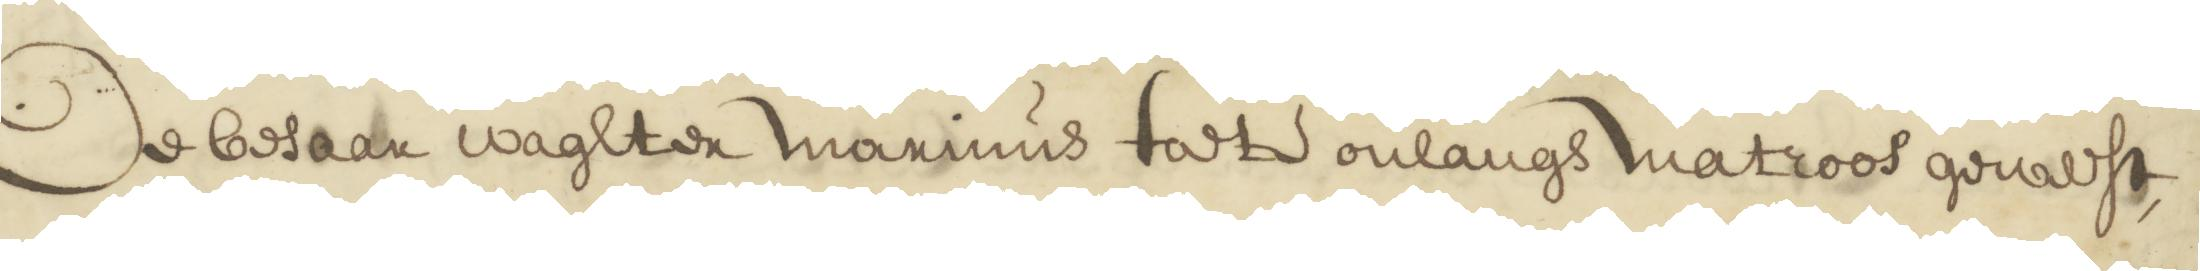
De besaar waghter marinus toete onlangs matroos geweest,
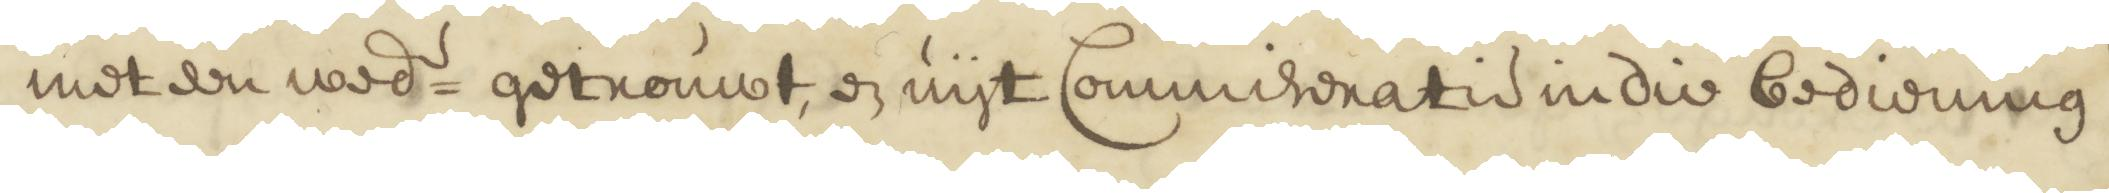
met een wed=s getrouwt, en uijt Commiseratie in die bediening
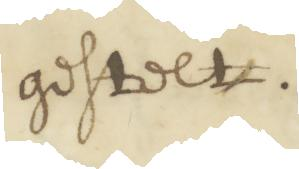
gestelt.
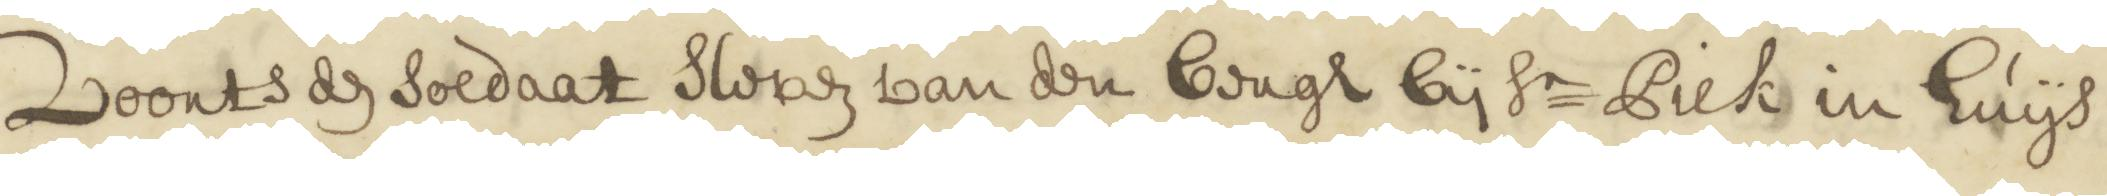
Voorts den soldaat sleven van den bergh bij s=r Piek in huijs
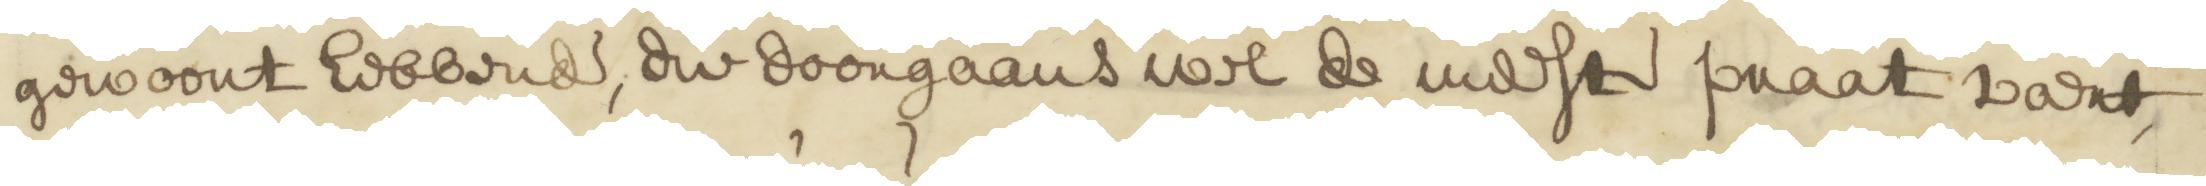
gewoont hebbende, die doorgaans wel de meeste praat voert,
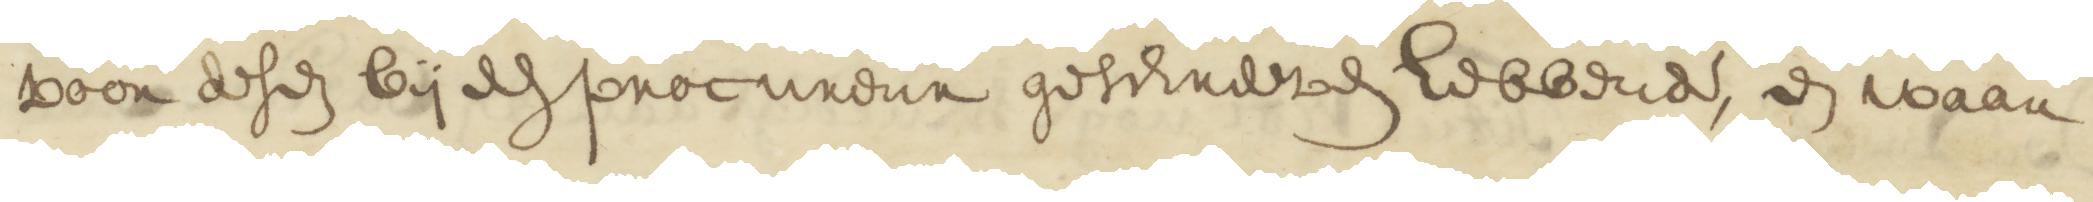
voor desen bij een procureur geschreeven hebbende, en waar
